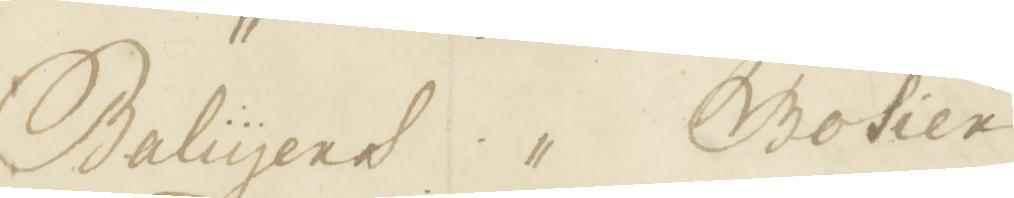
Baleijers „ Bosier
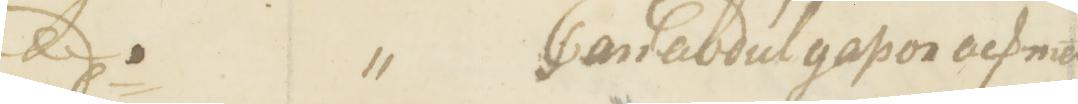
& d=o „ Tan abdul gapor over met
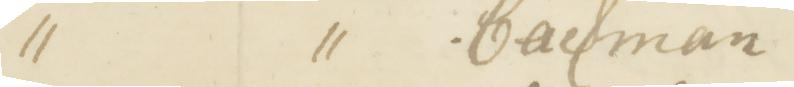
„ „ baverman
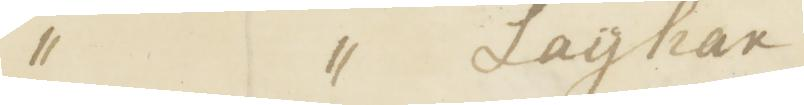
„ „ Laijhar
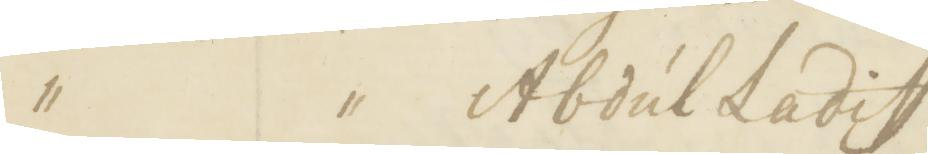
„ „ Abdul Ladiff
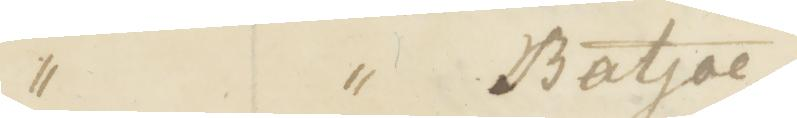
„ „ Batjoe
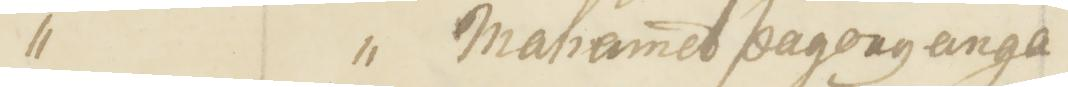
„ „ Mahamet pagory anga
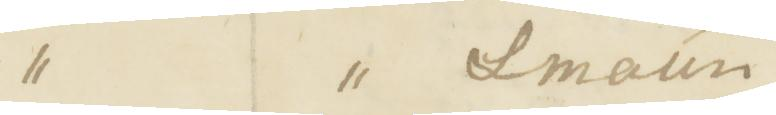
„ „ smaun
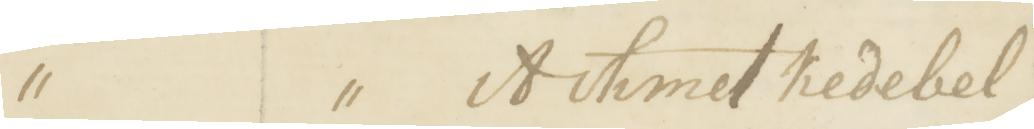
„ „ Achmet kedebel
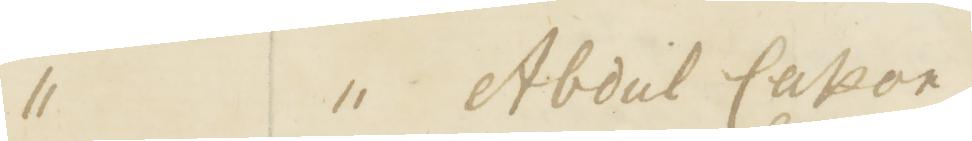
„ „ Abdul Capor
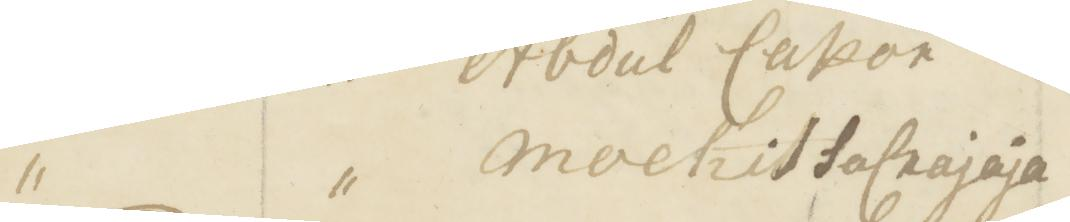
„ „ moehit sacrajaja
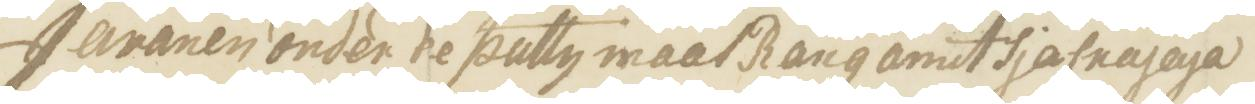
Javanen onder de pattij maas Rang amit sjacrajaja
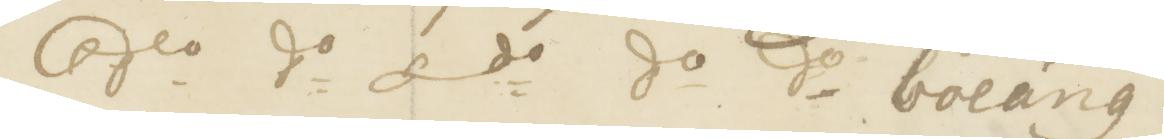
d-o d=o d=o d-o d=o bolang
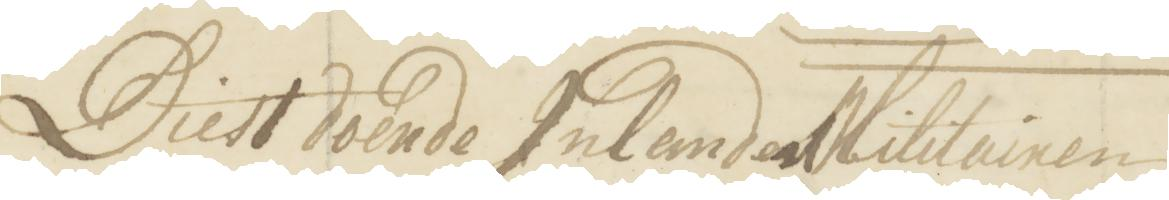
Diest doende Jnlanden Militairen
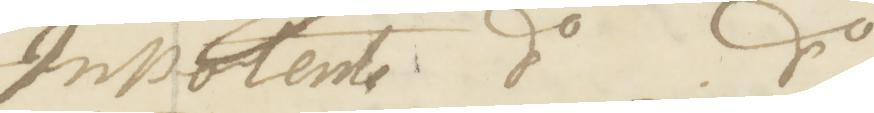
Jnpotente do d=o
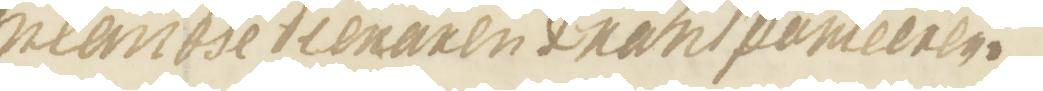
Jnlandse dienaren Transporteeren.
